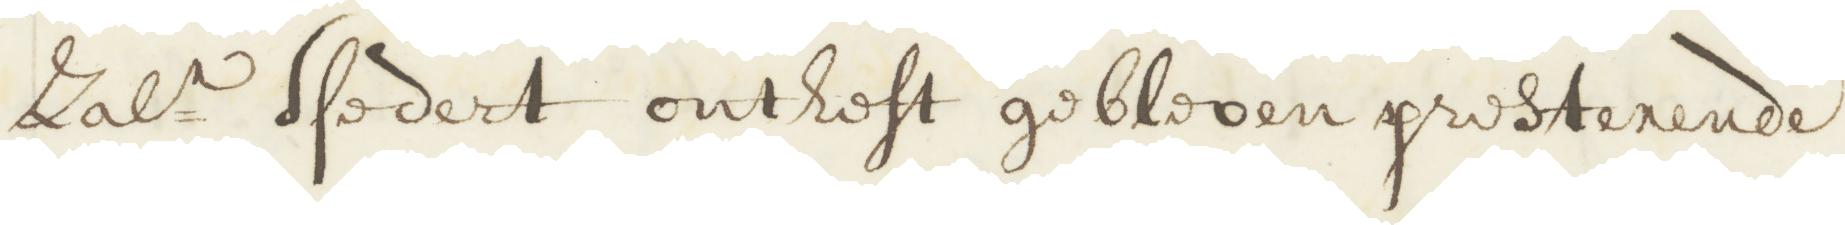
Zal=r tsedert ontheft gebleven presterende
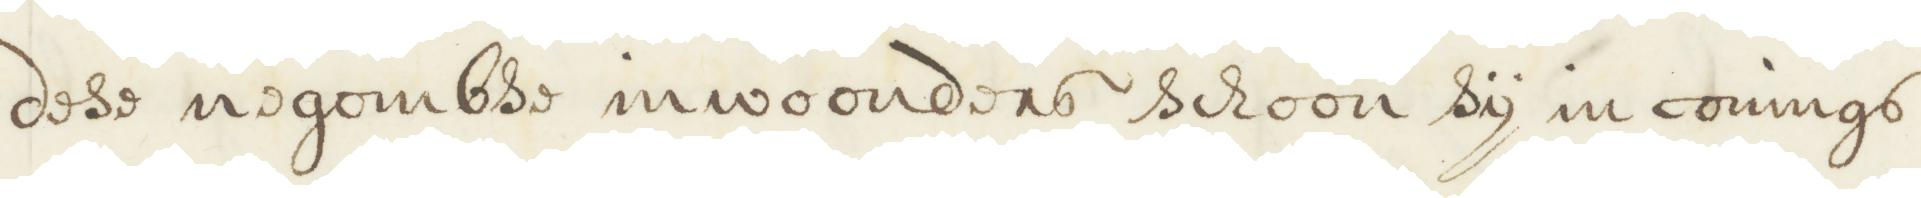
dese negombse inwoonders schoon sij in conings
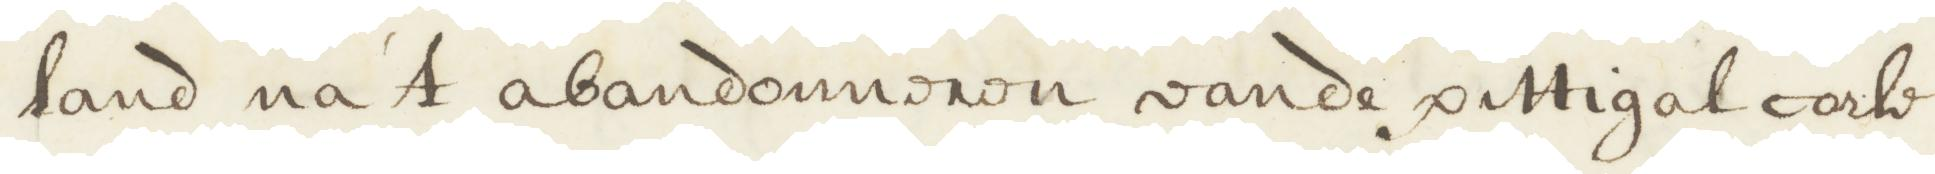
land na ’t abandonneren van de pittigal corle
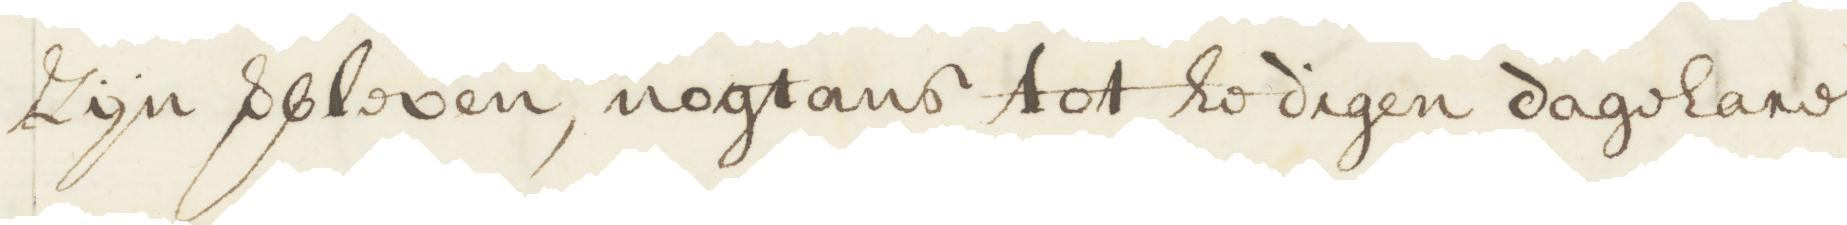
zijn verbleven, nogtans tot hedigen dage hare
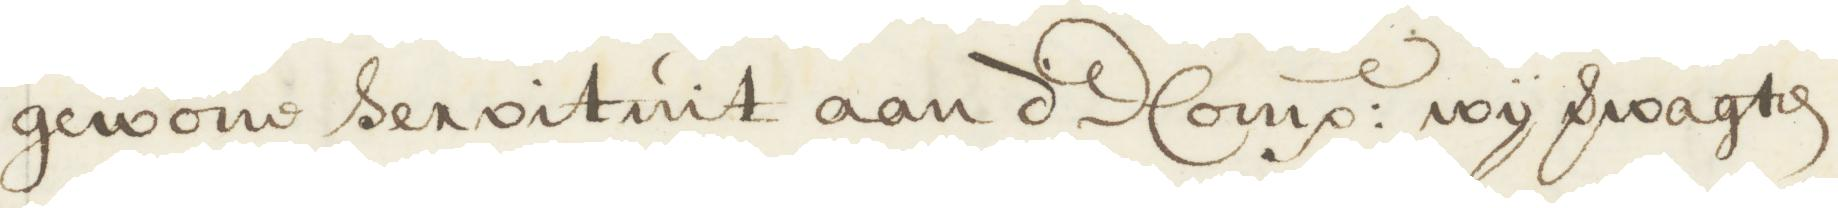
gewone servituit aan d’ E Comp:e wij verwagten
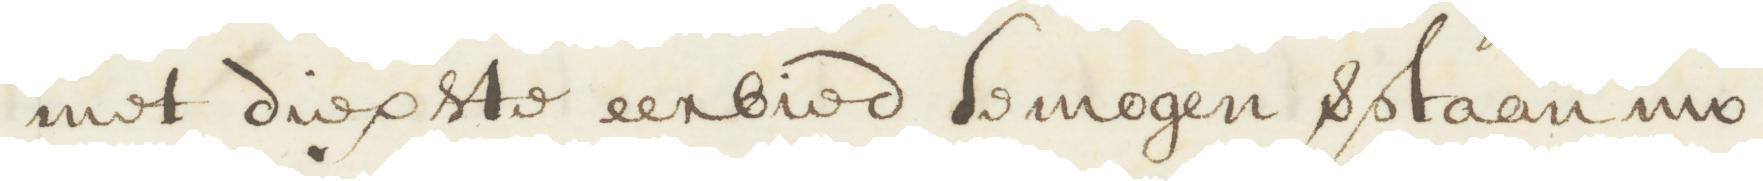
met diepste eerbied te mogen verstaan uw
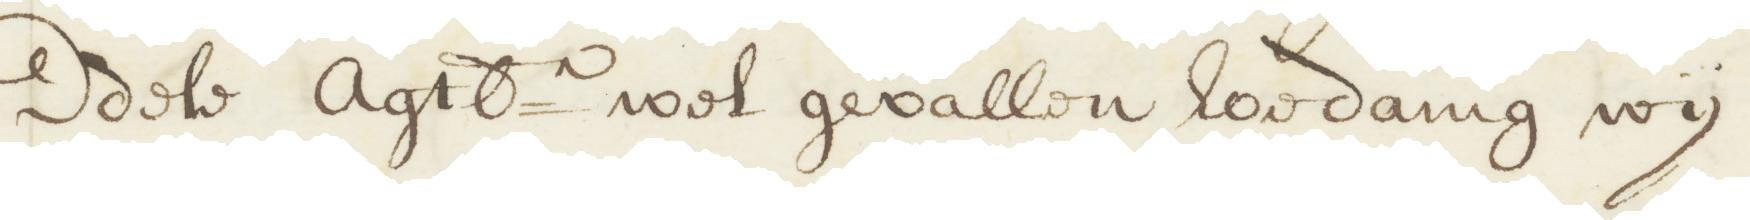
Edele agtb=n wel gevallen hoedanig wij
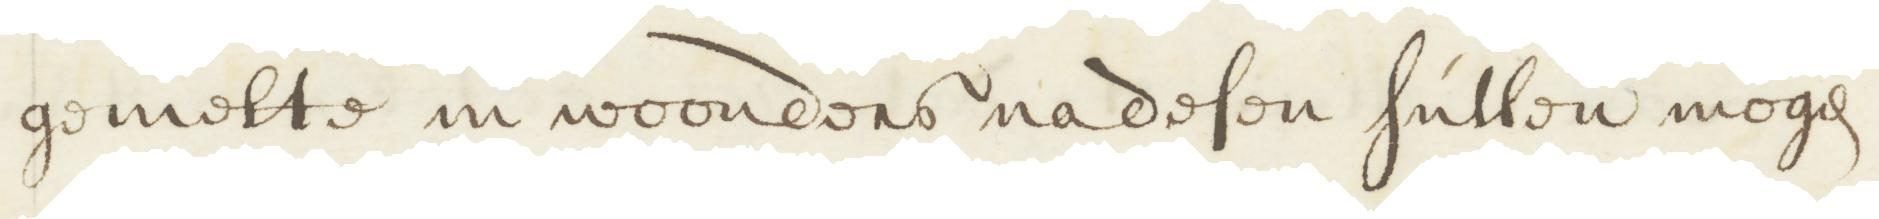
gemelte in woonders nadesen sullen mogen
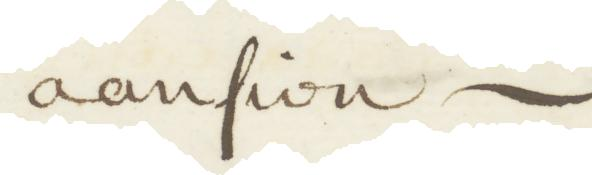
aansien —
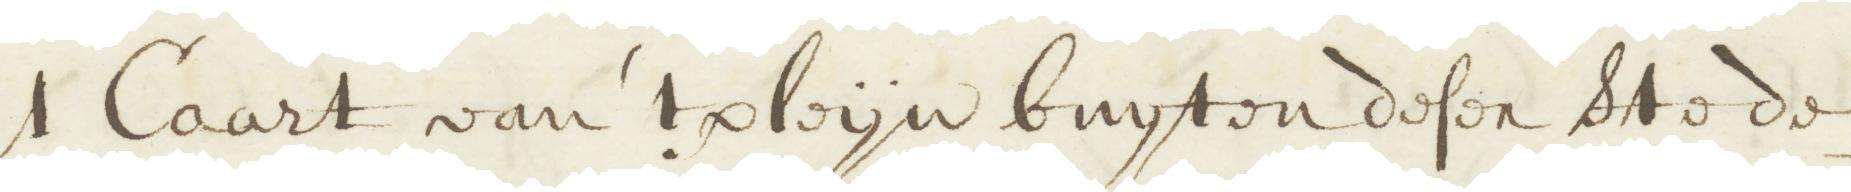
1 Caart van 'tpleijn buyten deser stede
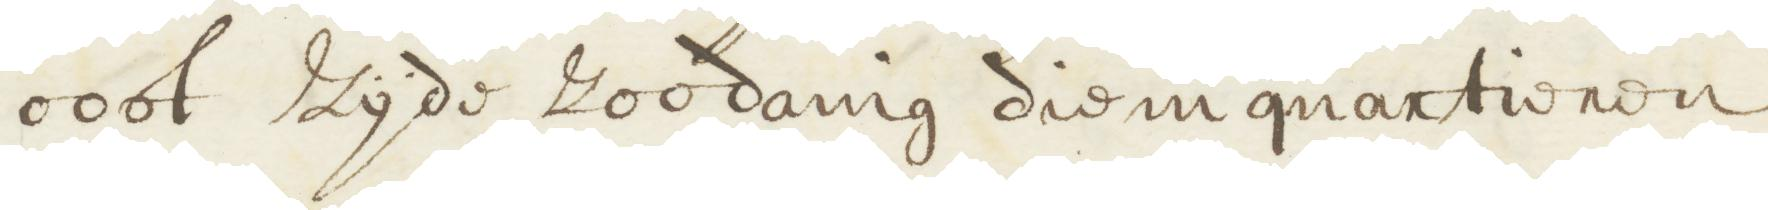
oost zijde, zoodanig die in quartieren
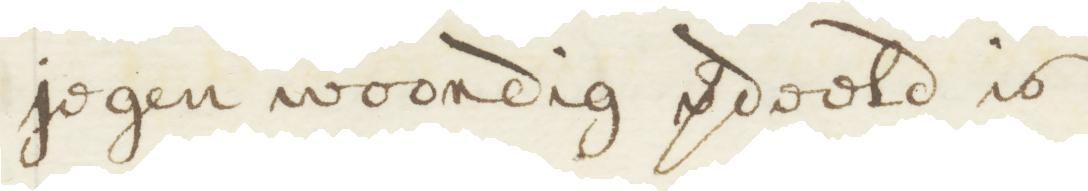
jegen woordig verdeeld is
